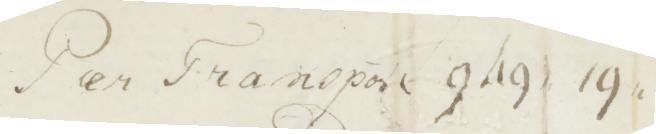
Per Transport 949„ 19„
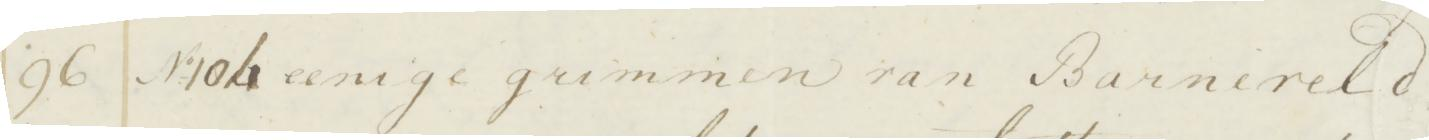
96. N=o 104 eenige grimmen van Barneveld
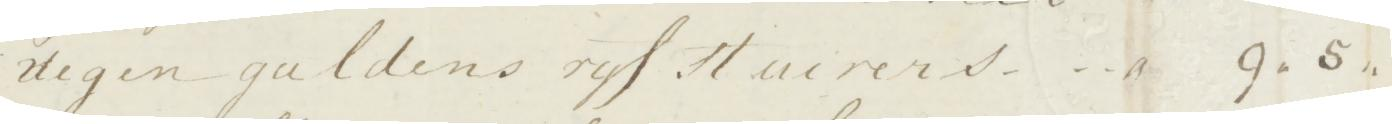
negen guldens vyf stuivers. . . . . 9„ 5 „
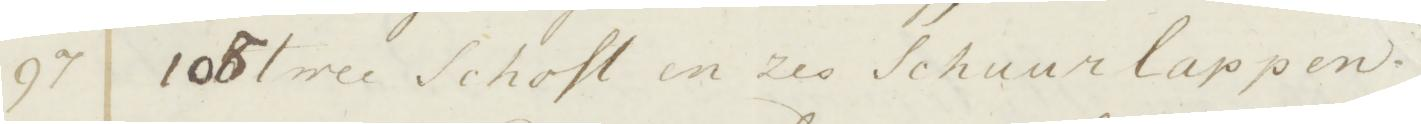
97 105 twee schoft en zes schuurlappen.
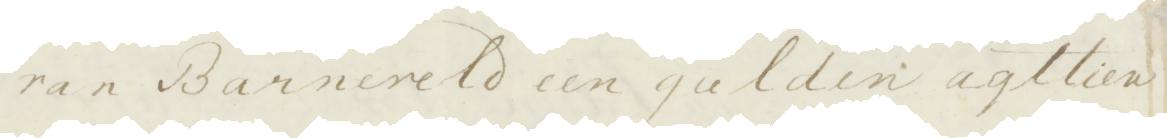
van Barneveld een gulden agttien
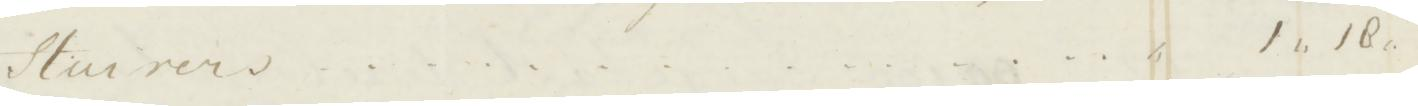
stuivers . . . . . . . . . . . . . . . „ 1„ 18„
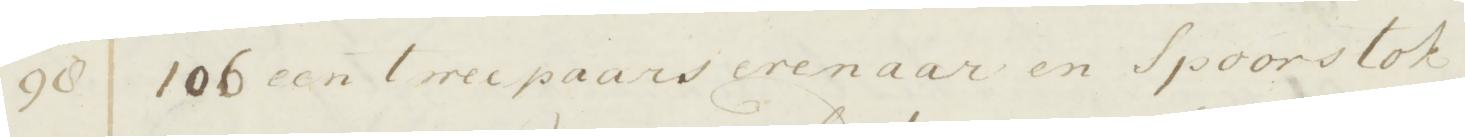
98 106 een twee paars evenaar en spoorstok
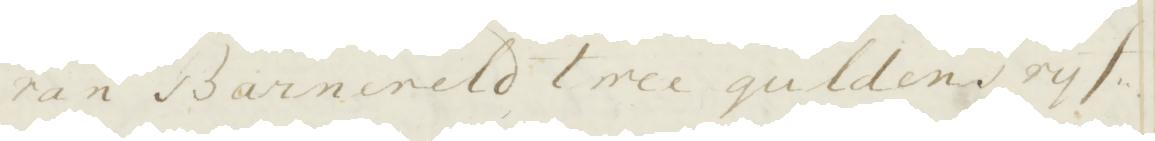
van Barneveld twee guldens vyf„
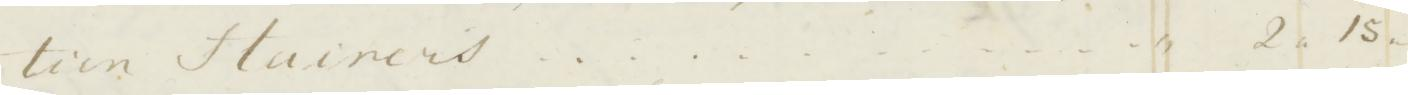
tien Stuivers . . . . . . . . . . . . „ 2„ 15„
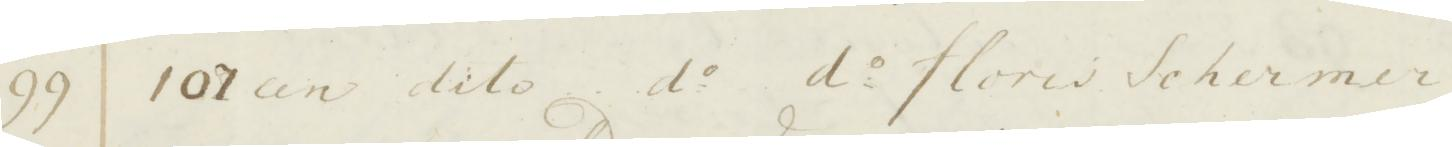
99 107 een dito. . . d=o . d=o Floris Schermer
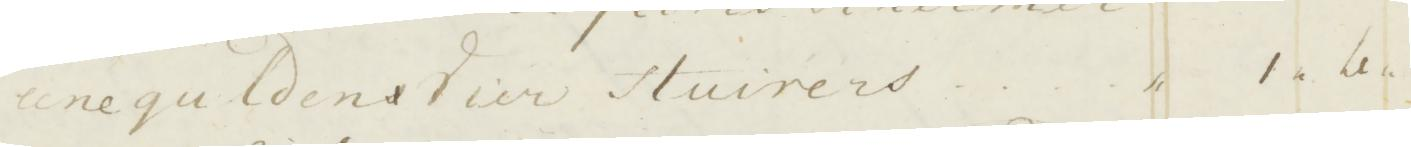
eene guldens Vier stuivers . . . . „ 1„ 4
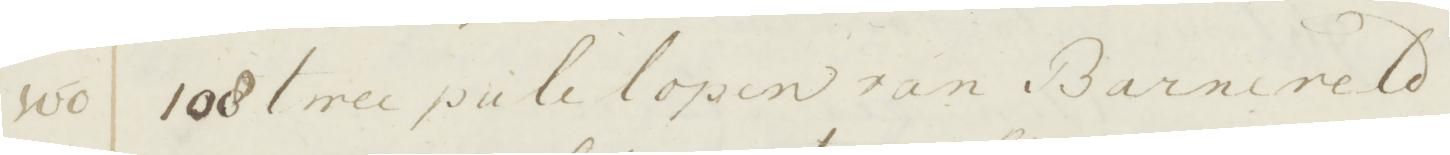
100 108 twee pulelopen van Barneveld
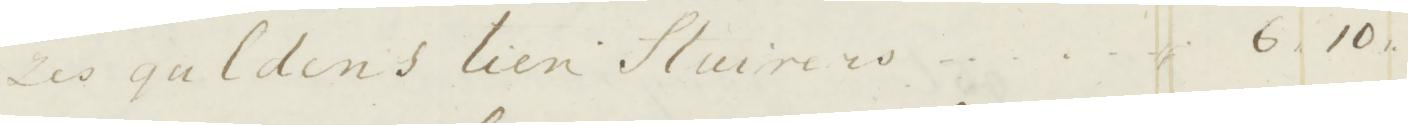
zes guldens tien Stuivers . . . . . . „ . 6„ 10„
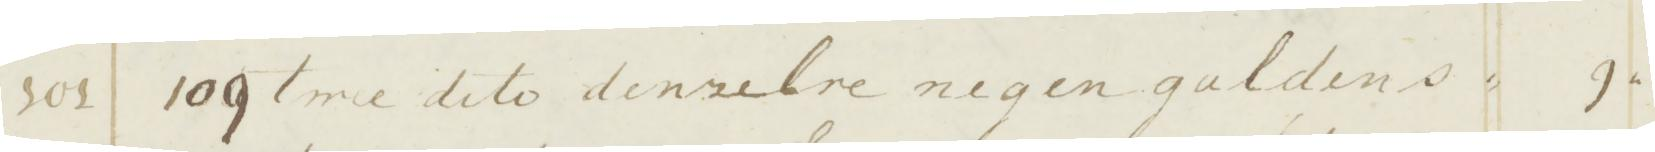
101 109 twee dito denzelve negen guldens „ 9„
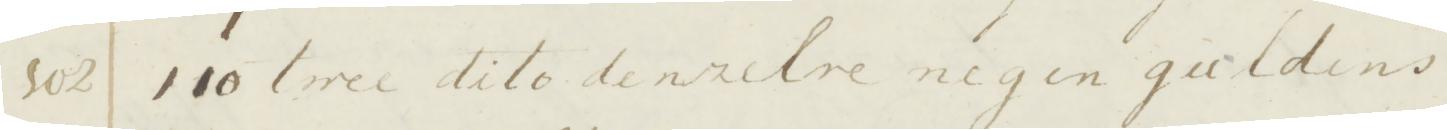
102 110 twee dito denzelve negen guldens
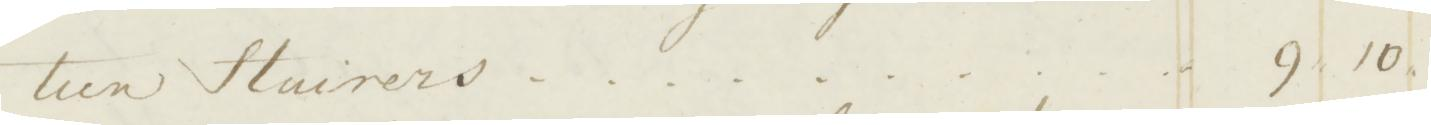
tien stuivers . . . . . . . . . . „ 9„ 10„
